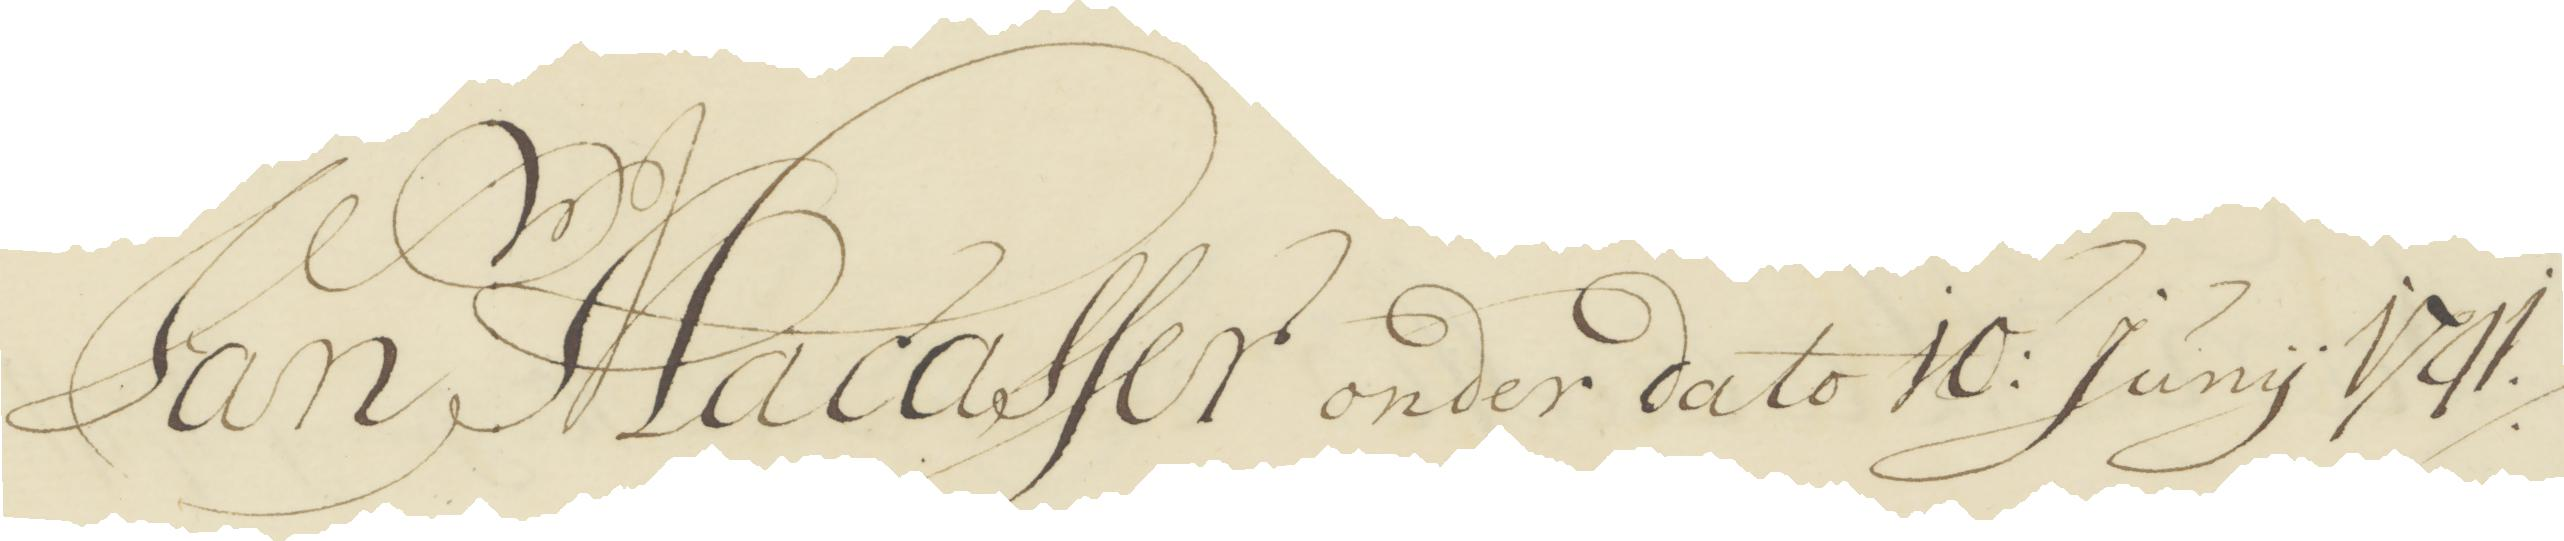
Van Macasser onder dato 10:' Junij 1741./.
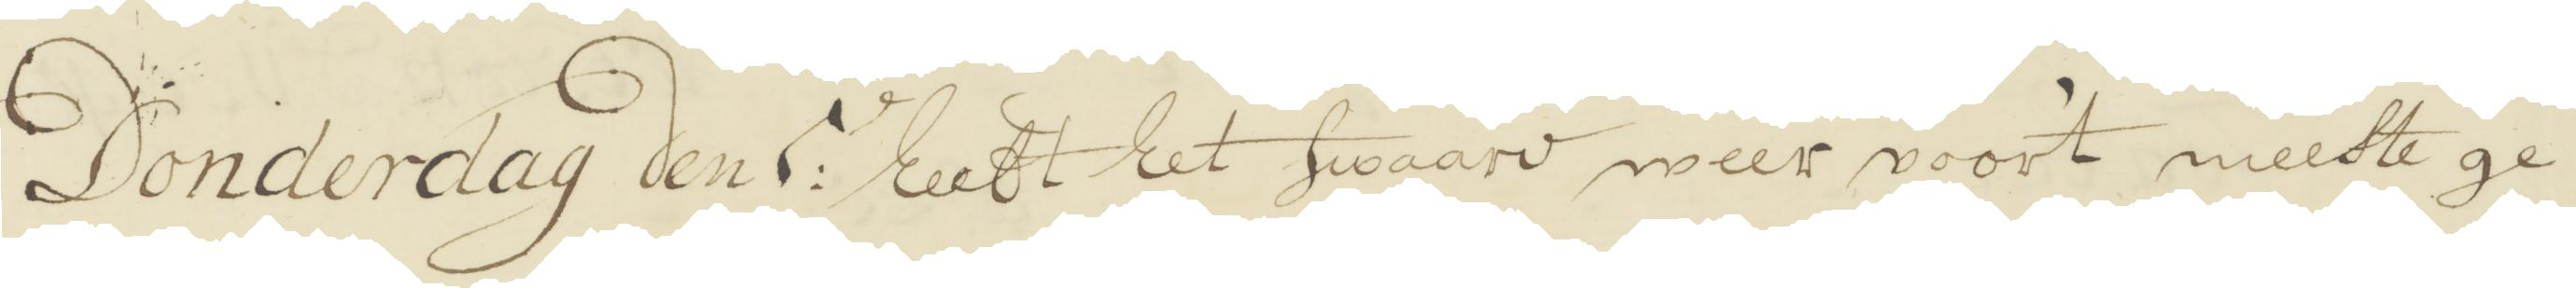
Donderdag den 5:' heeft het swaare weer voor’t meeste ge
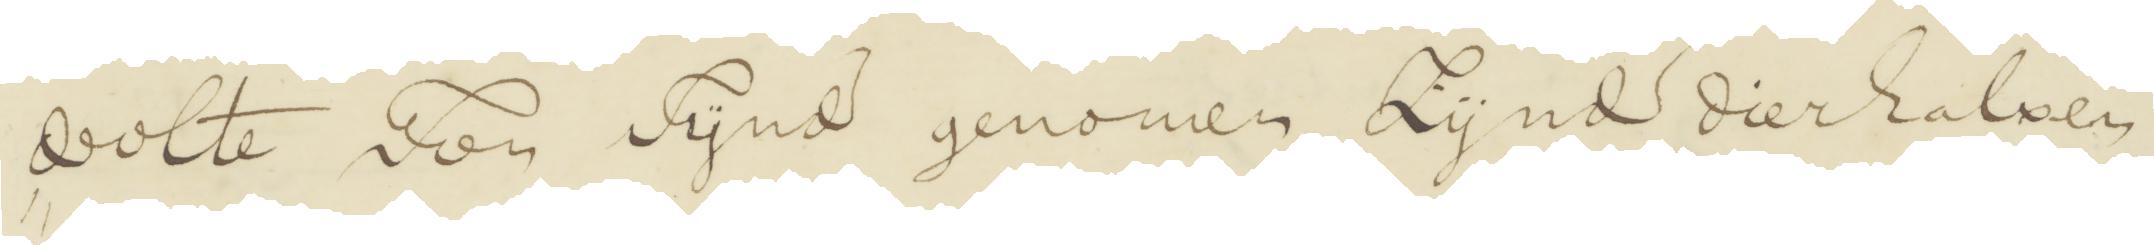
„deelte Een Eijnde genomen zijnde dierhalven
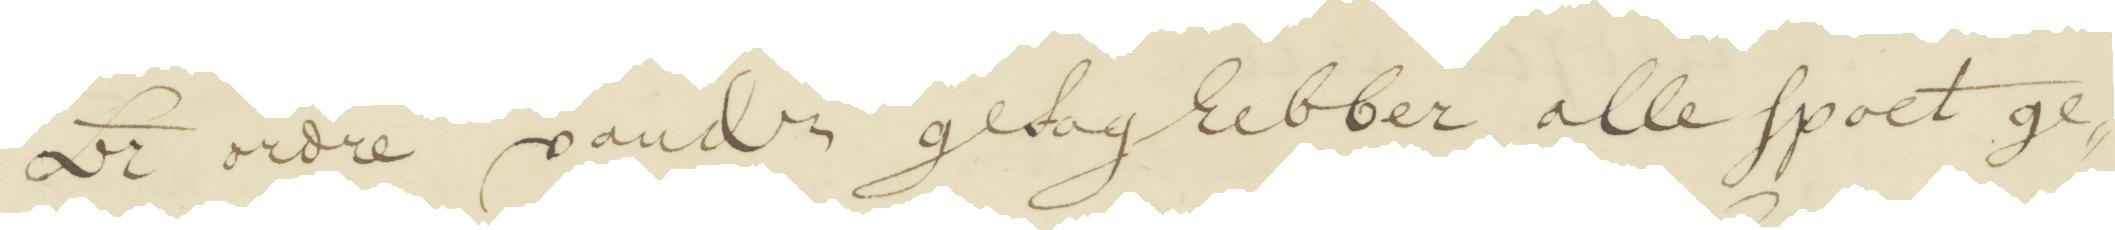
ter ordre vanden gesaghebber alle spoet ge„
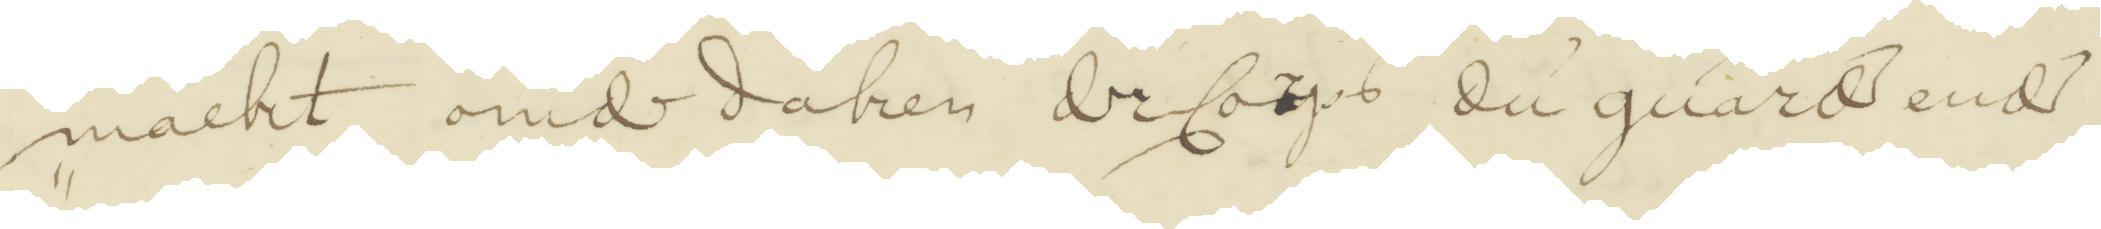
„maekt om de daken der Corps du guarde ende
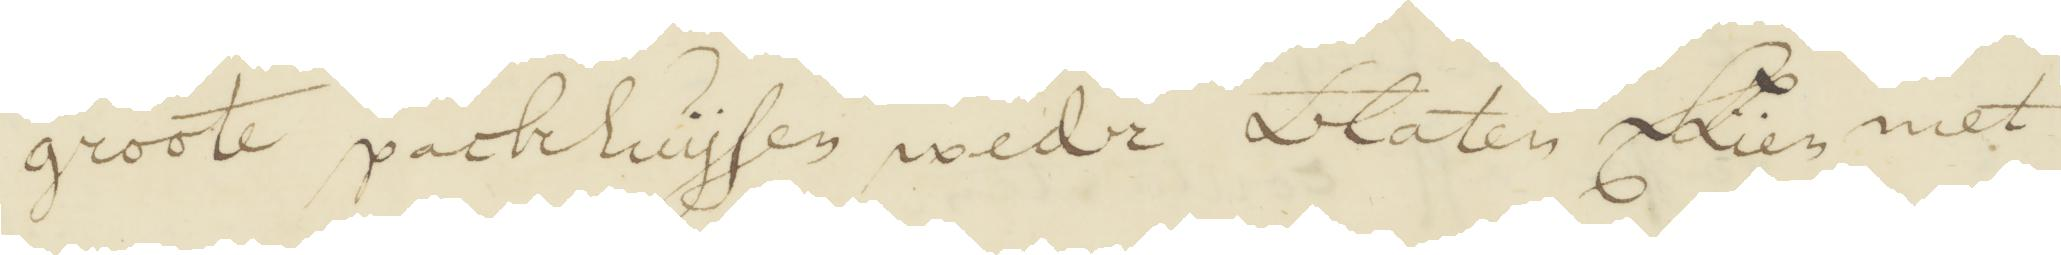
groote packhuijsen weder telaten verzien met
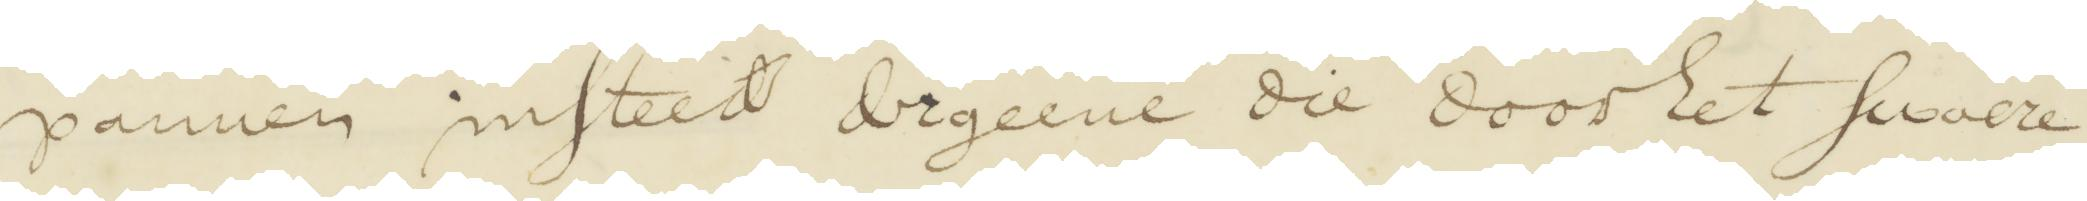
pannen insteede dergeene die door het swaere
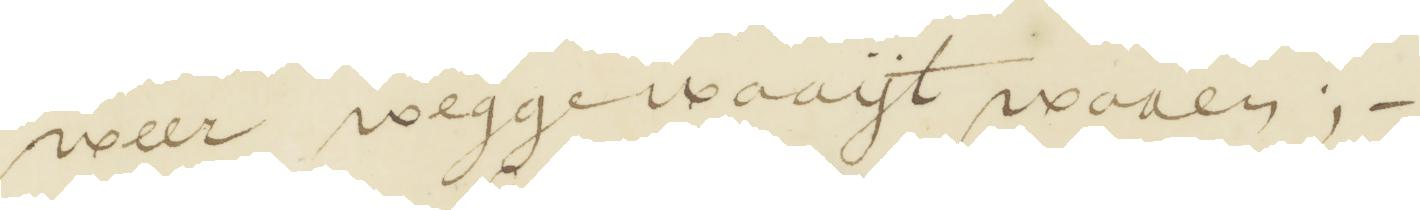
weer weggewaaijt waren;-
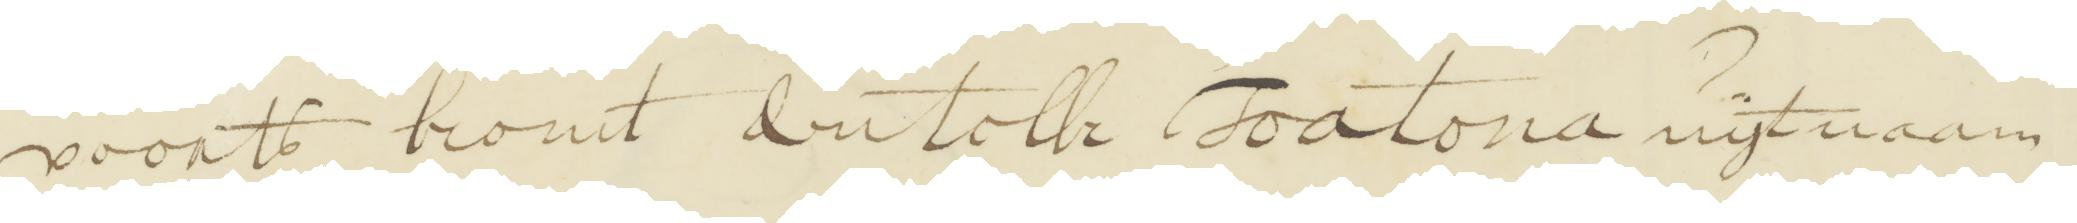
voorts komt den tolk Toatona uijt naam
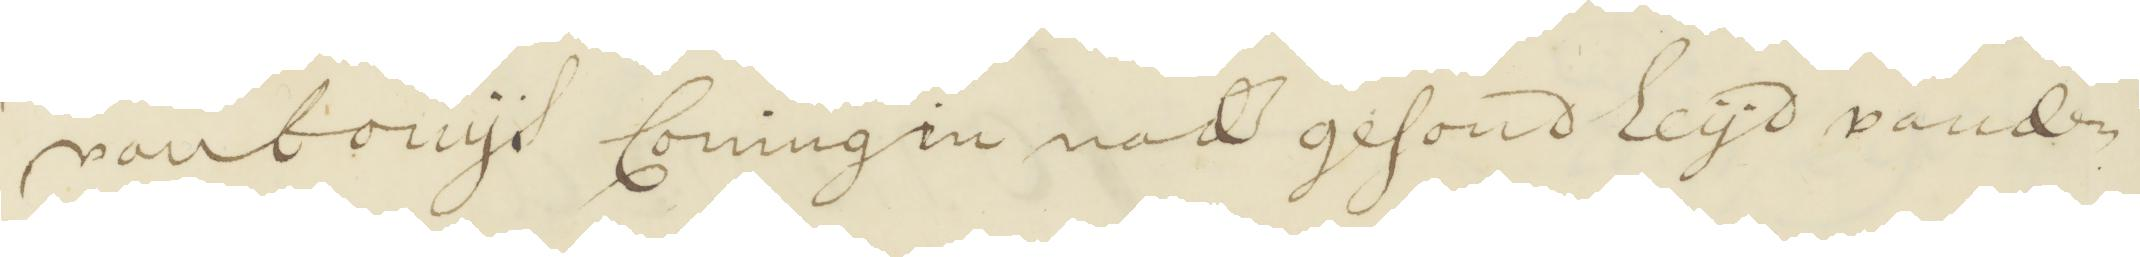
van bonijs Coning in nade gesondheijd vanden
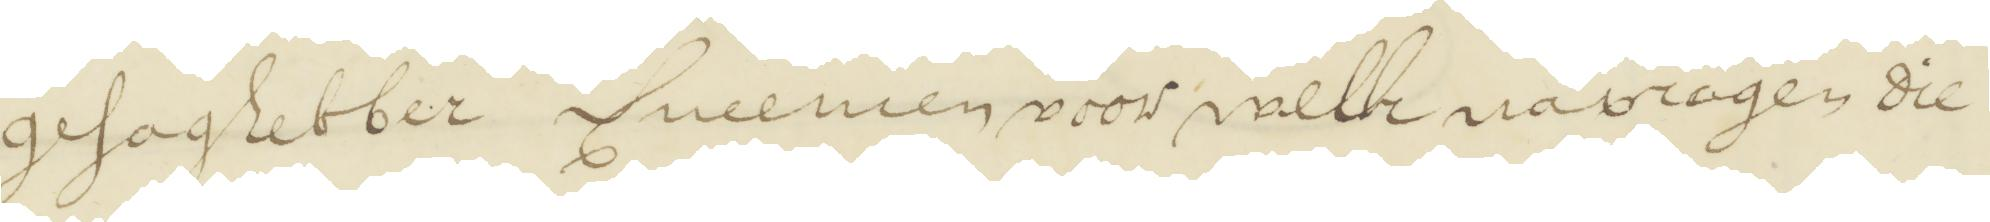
gesaghebber verneemen voor welk navragen die
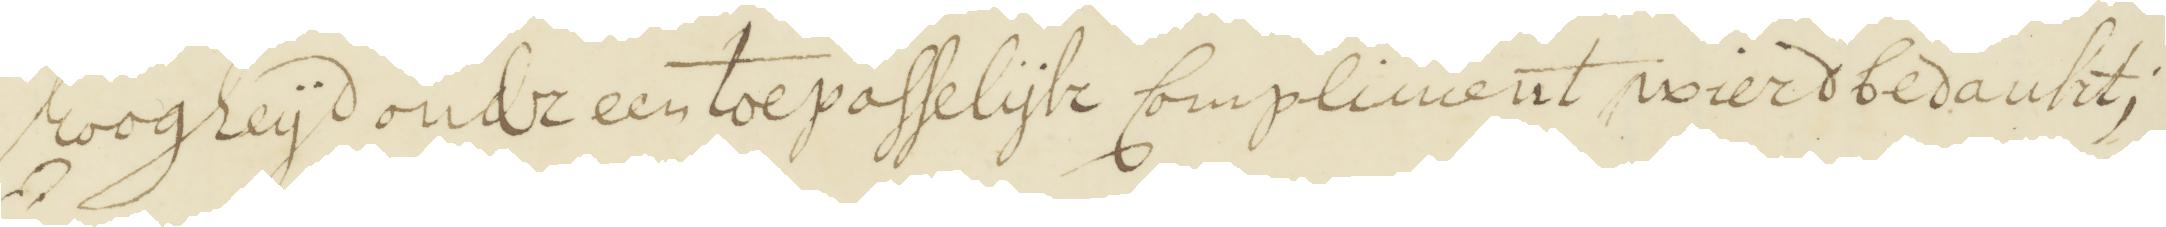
hoogheijd onder een toepasselijk Compliment wierd bedankt;
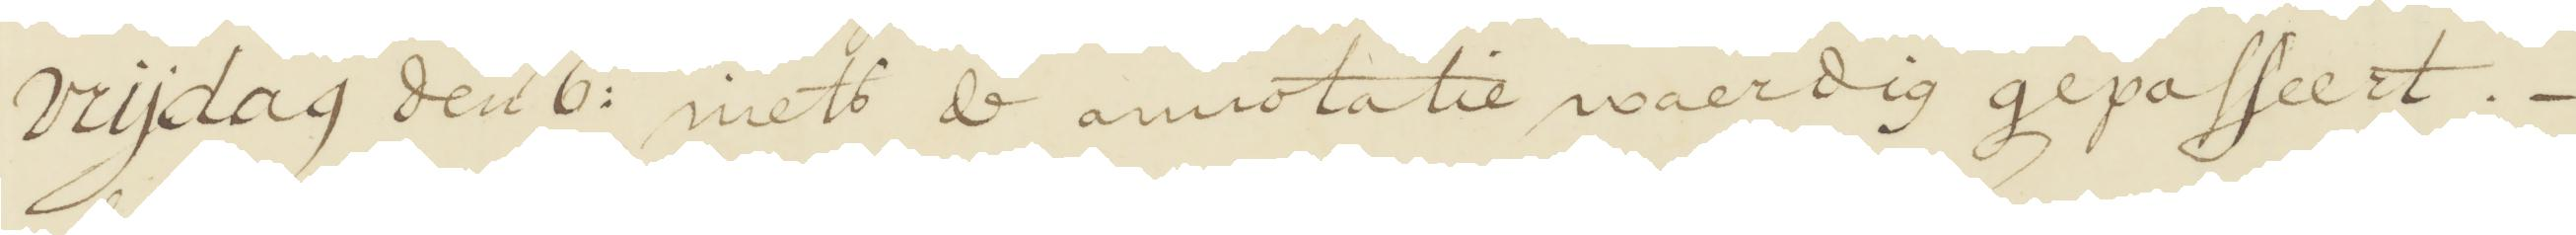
vrijdag den 6:' niets de annotatie waerdig gepasseert.-
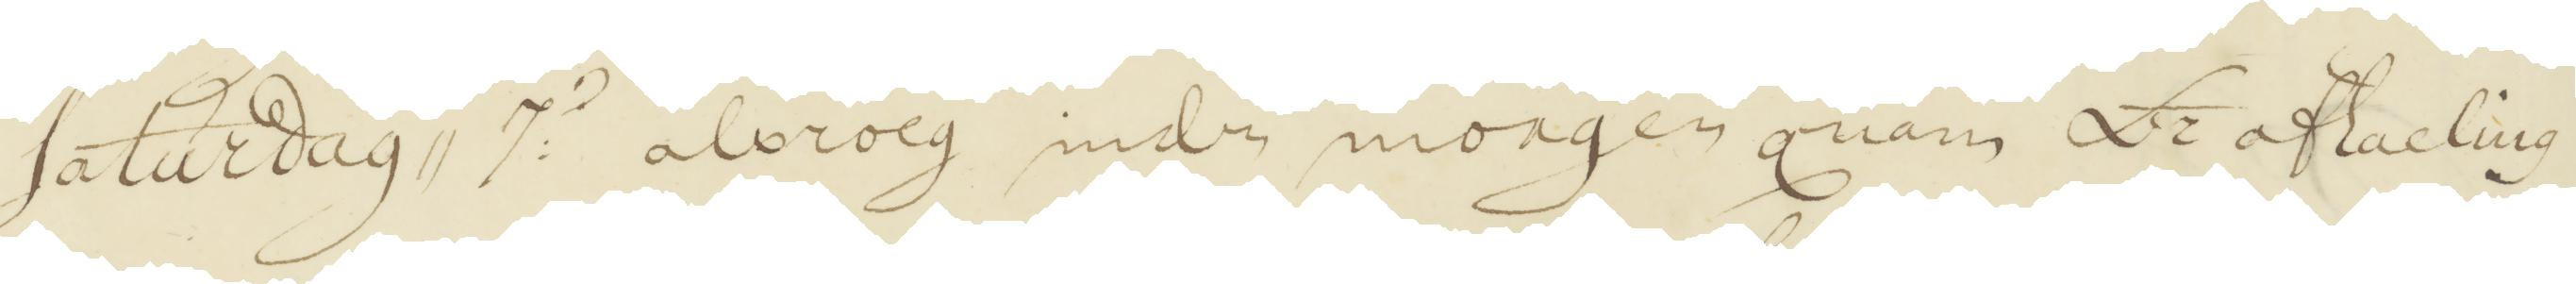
Saturdag „ 7:' alvroeg inden morgen quam ter afhaeling
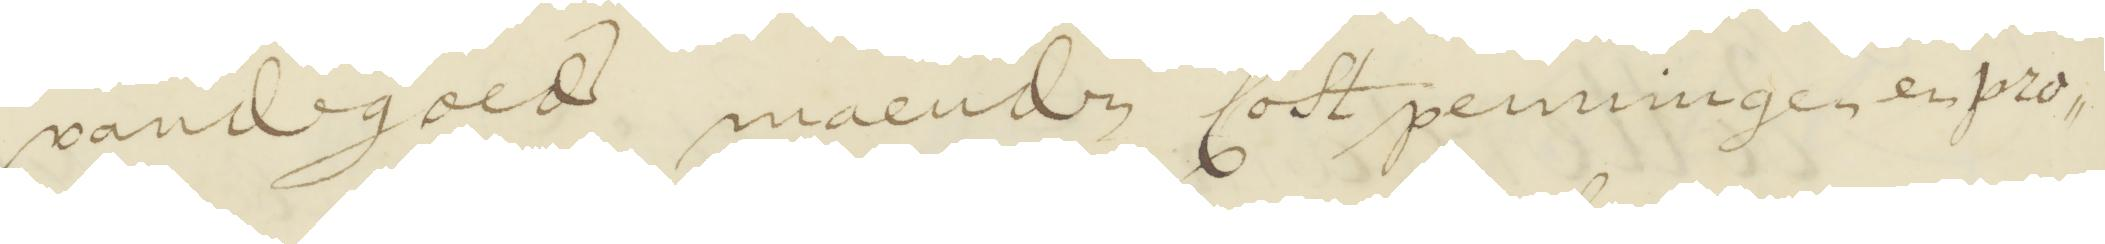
van de goede maenden Cost penningen en pro„
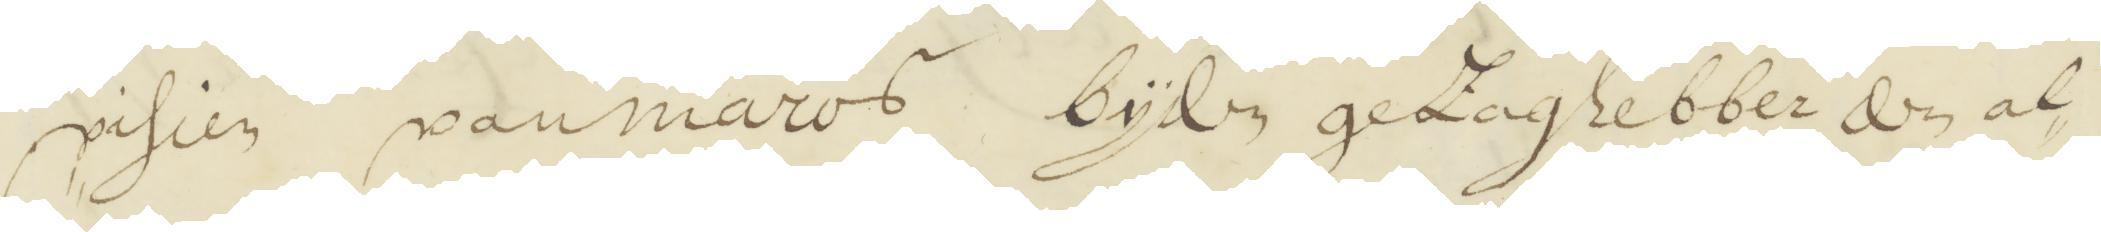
„visien van maros bijden gezag hebber den al„
